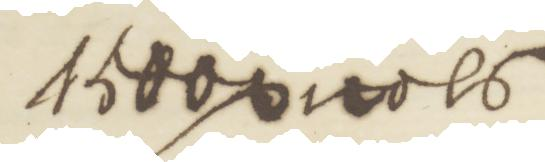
1500 picols
